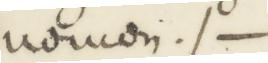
nemen. / –
